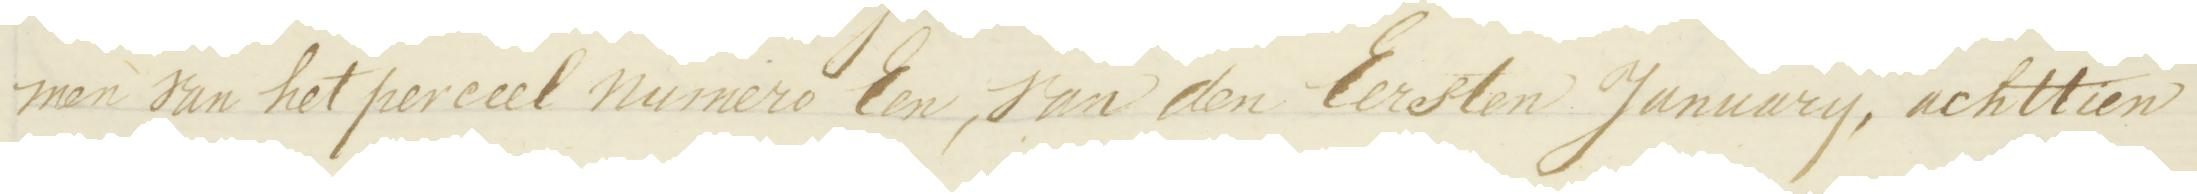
men van het perceel numero Een, van den Eersten January, achttien
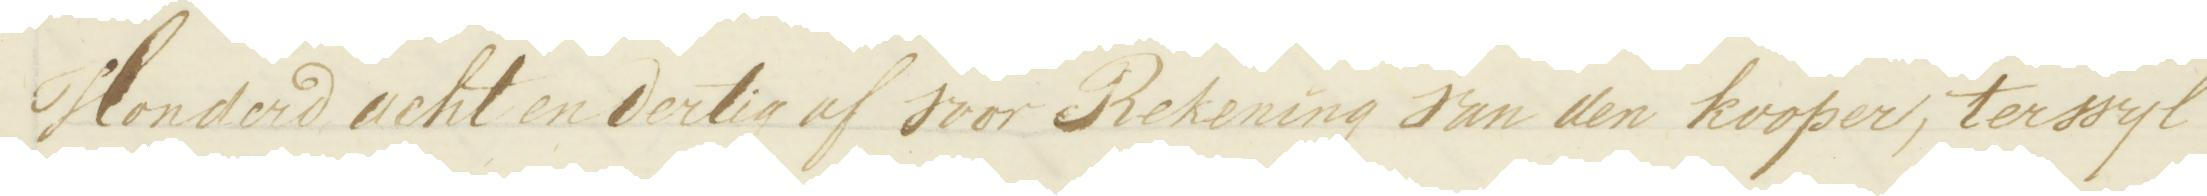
Honderd acht en dertig af voor Rekening van den kooper, terwyl
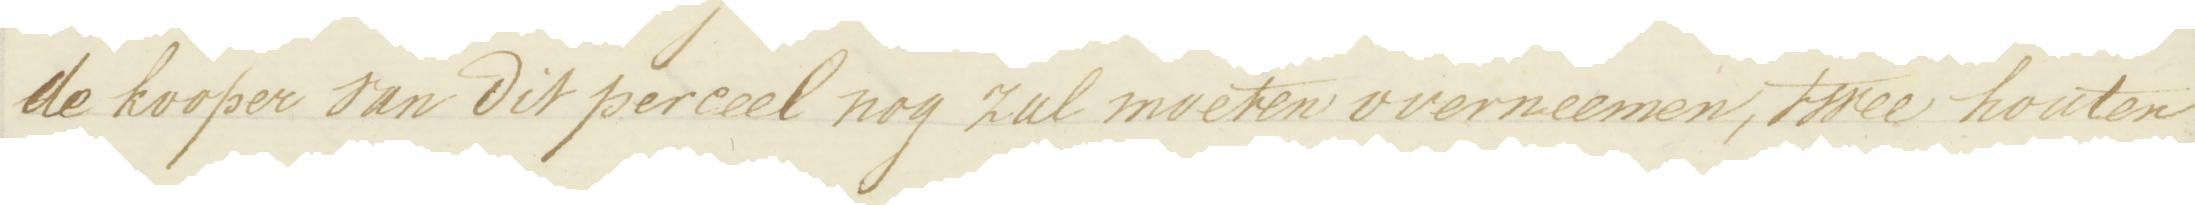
de kooper van dit perceel nog zal moeten overneemen, twee houten
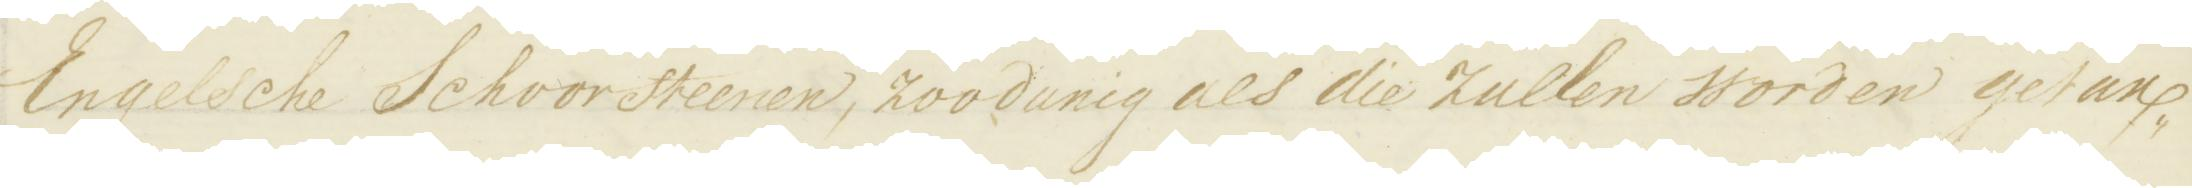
Engelsche Schoorsteenen, zoodanig als die zullen worden getax„
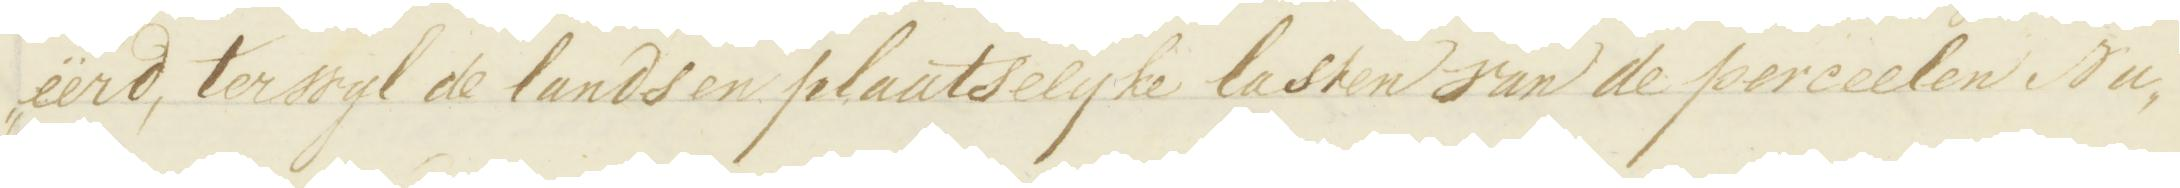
„eerd, terwyl de lands en plaatselyke lasten van de perceelen Nu„
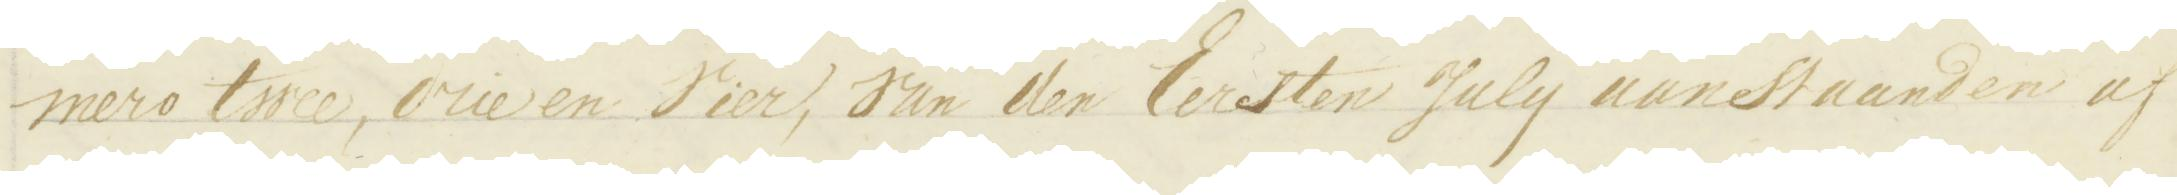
mero twee, drie en Vier, van den Eersten July aanstaanden af
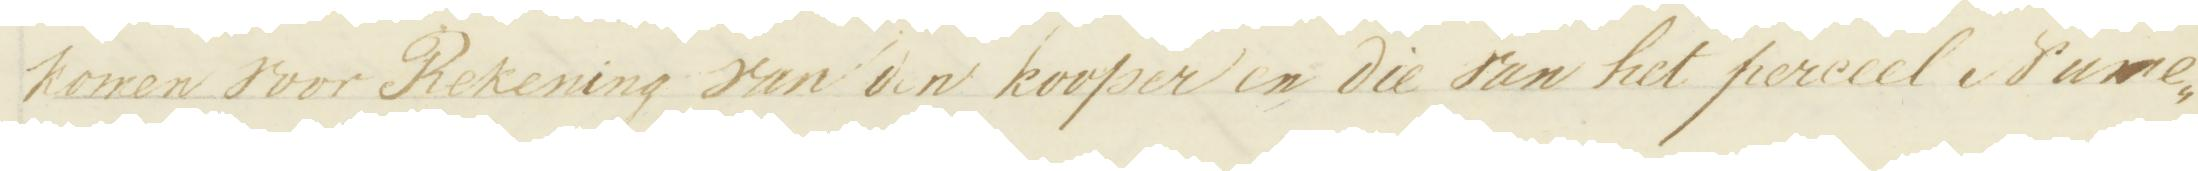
komen voor Rekening van den kooper en die van het perceel Nume„
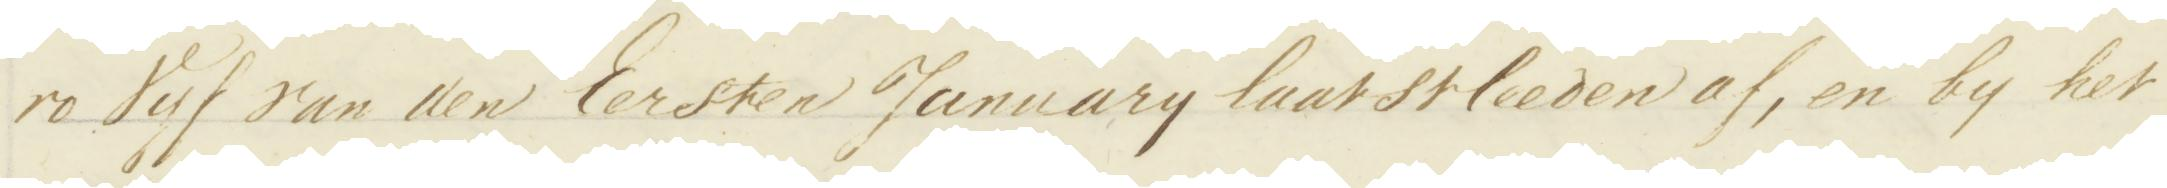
ro Vyf van den Eersten January laatstleeden af, en by het
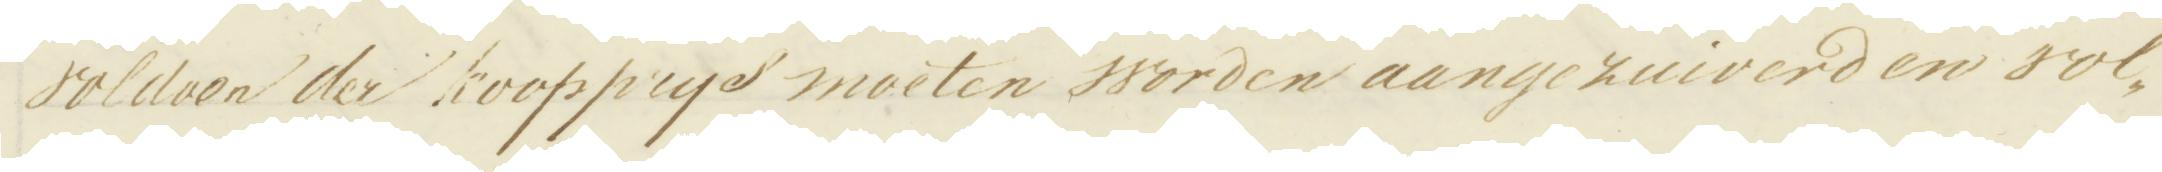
voldoen der koopprys moeten worden aangezuiverd en vol„
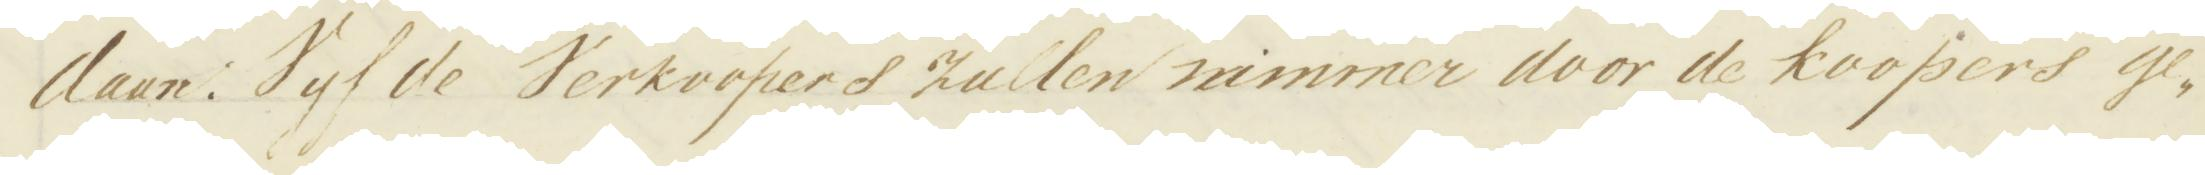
daan. Vyf de Verkoopers zullen nimmer door de koopers ge„
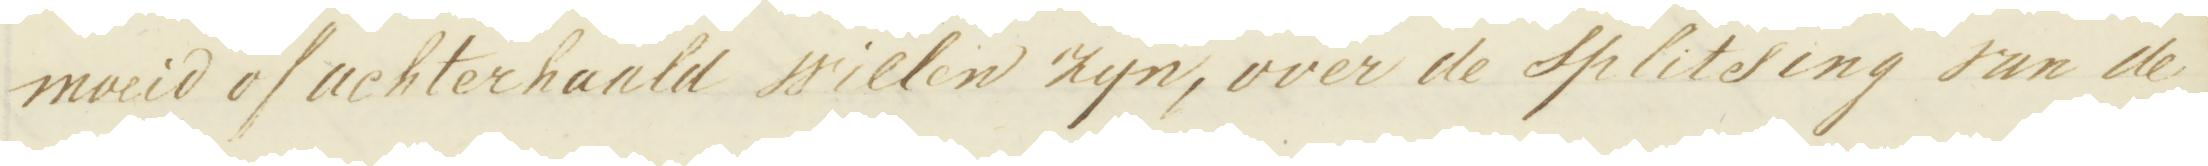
moeid of achterhaald willen zyn, over de splitsing van de
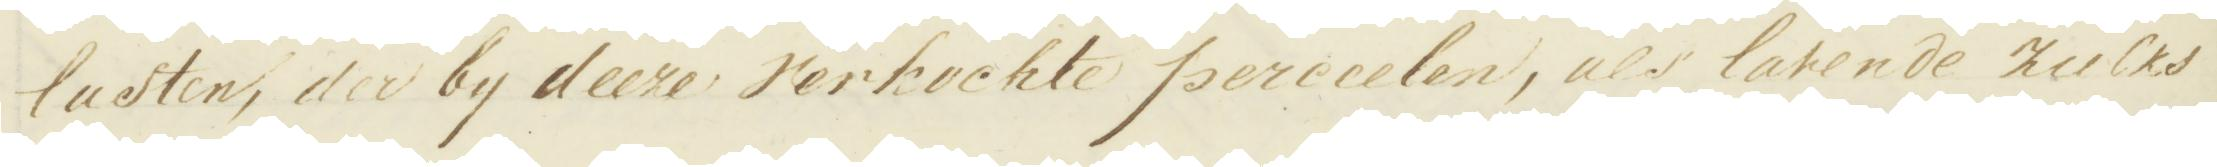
lasten, der by deeze verkochte perceelen, als latende zulks
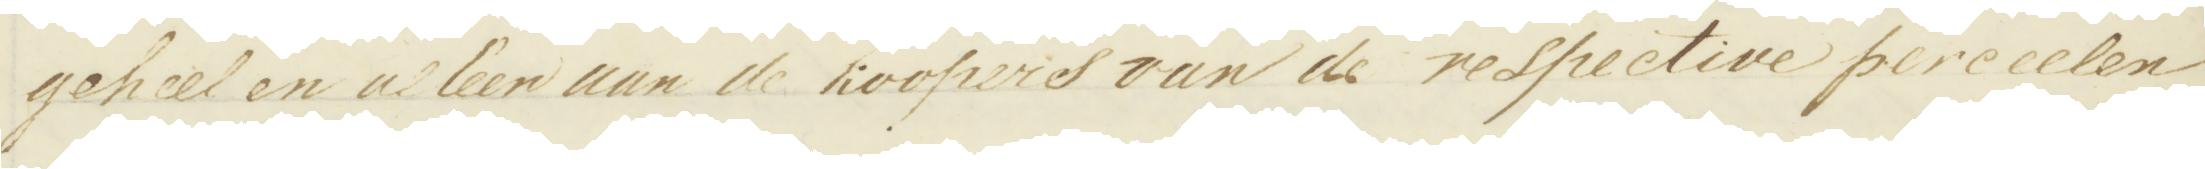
geheel en alleen aan de koopers van de respective perceelen
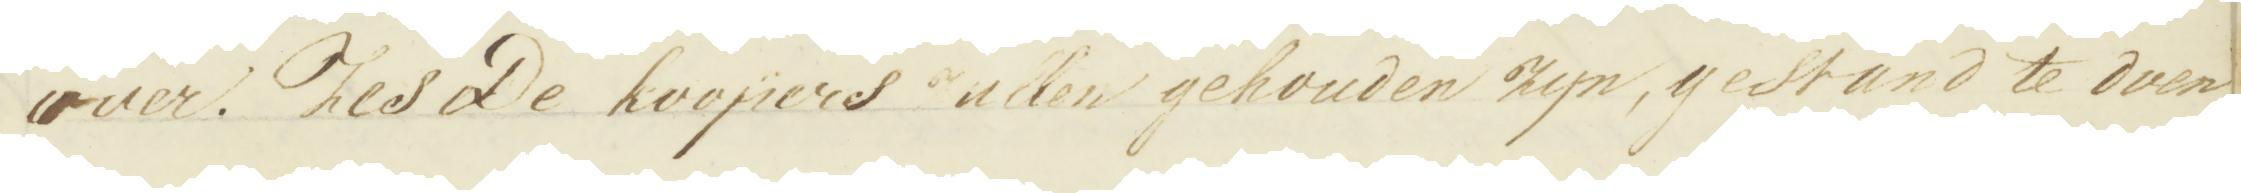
over. Zes De koopers zullen gehouden zyn, gestand te doen
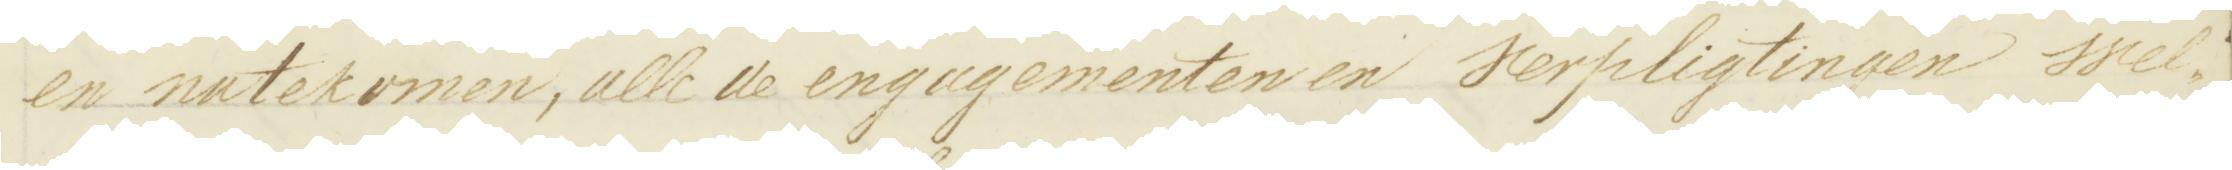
en na te komen, alle de engagementen en Verpligtingen wel„
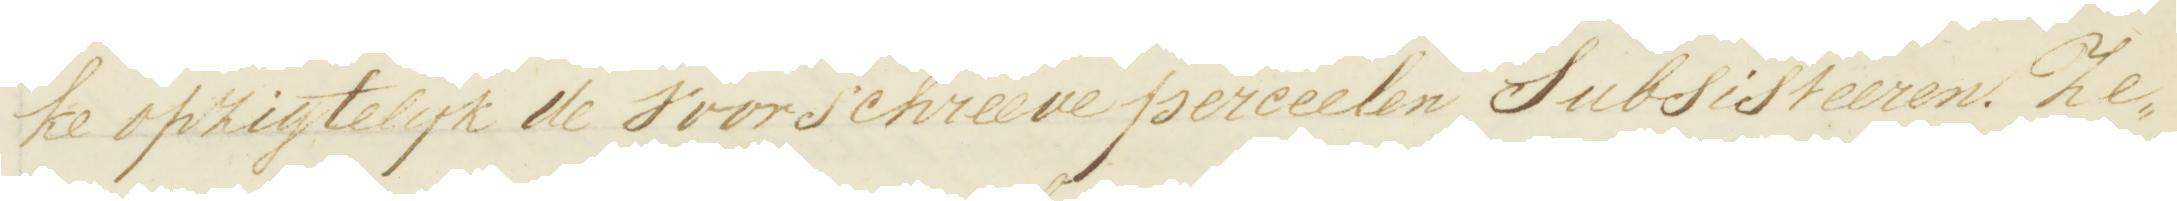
ke opzigtelyk de voorschreeve perceelen Subsisteeren. Ze„
